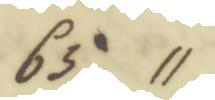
65 „
